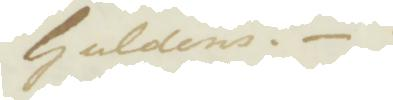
Guldens. —
